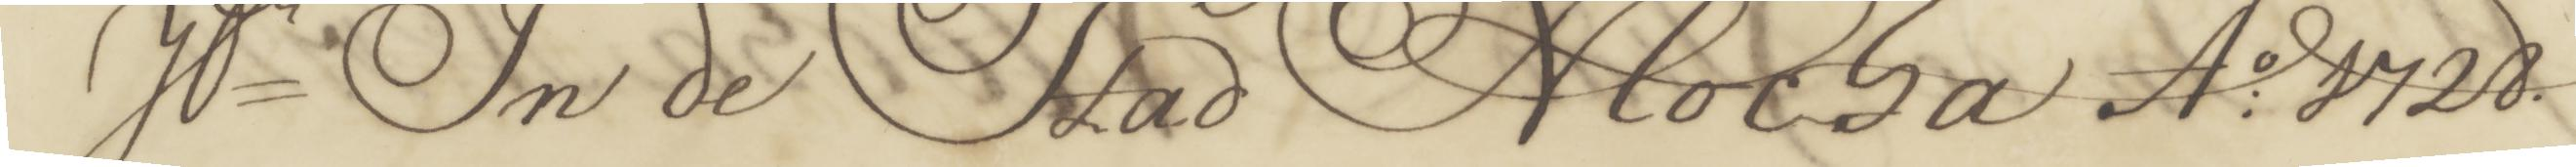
7b=r In de Stad Mocha A:o 1728.
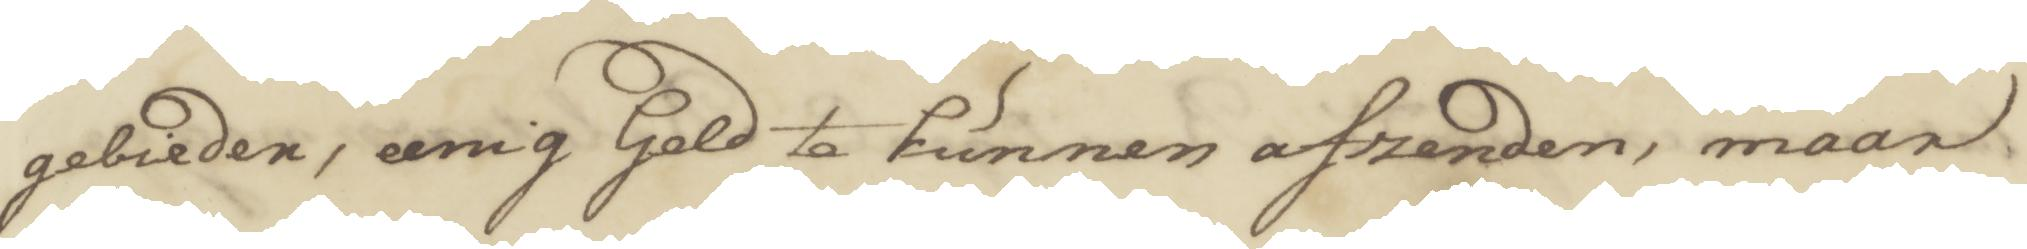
gebieder, eenig Geld te kunnen afzenden, maar
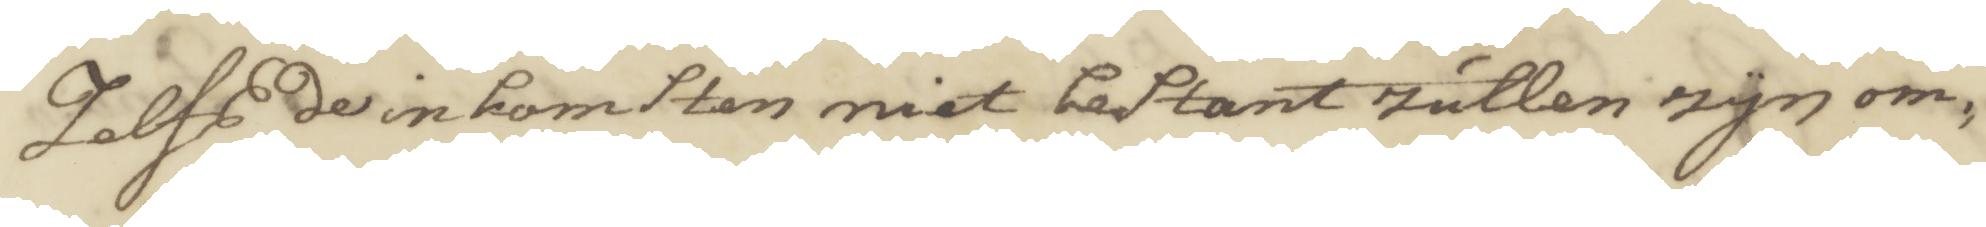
zelfs de inkomsten niet bestant zullen zijn om„
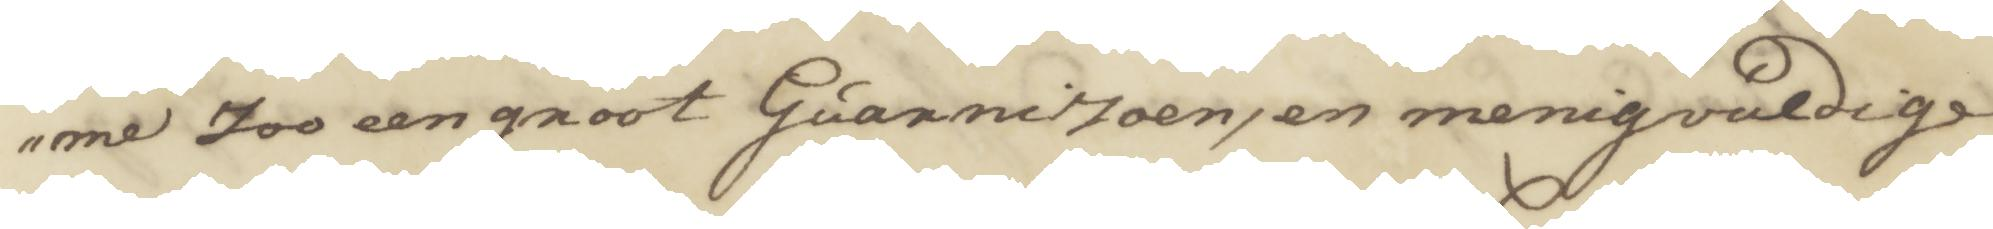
„me zoo een groot Guarnizoen, en menigvuldige
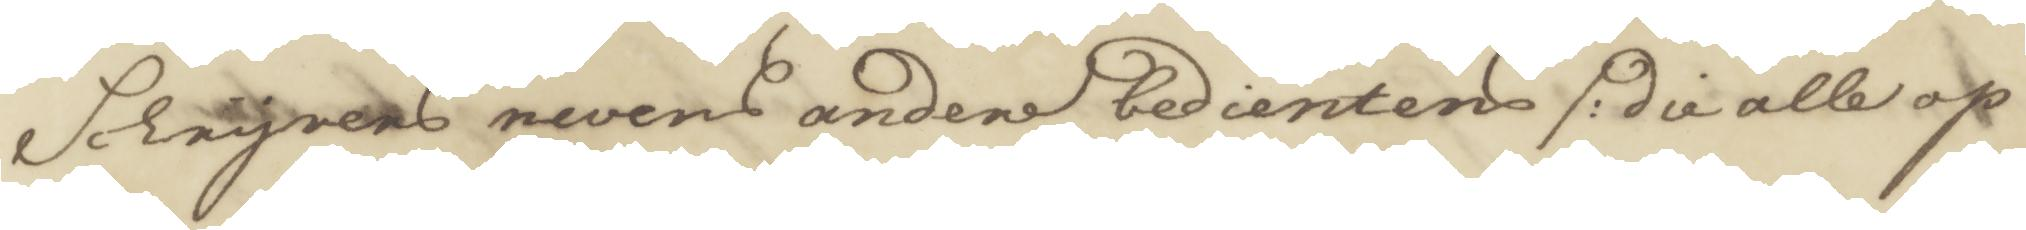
schrijvens nevens andere bedientens /: die alle op
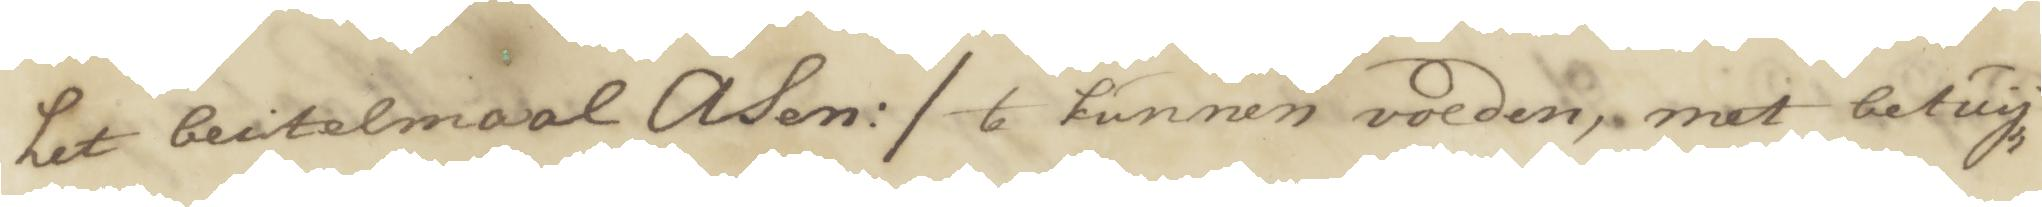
het beitelmaal Asen:/ te kunnen voeden, met betuij„
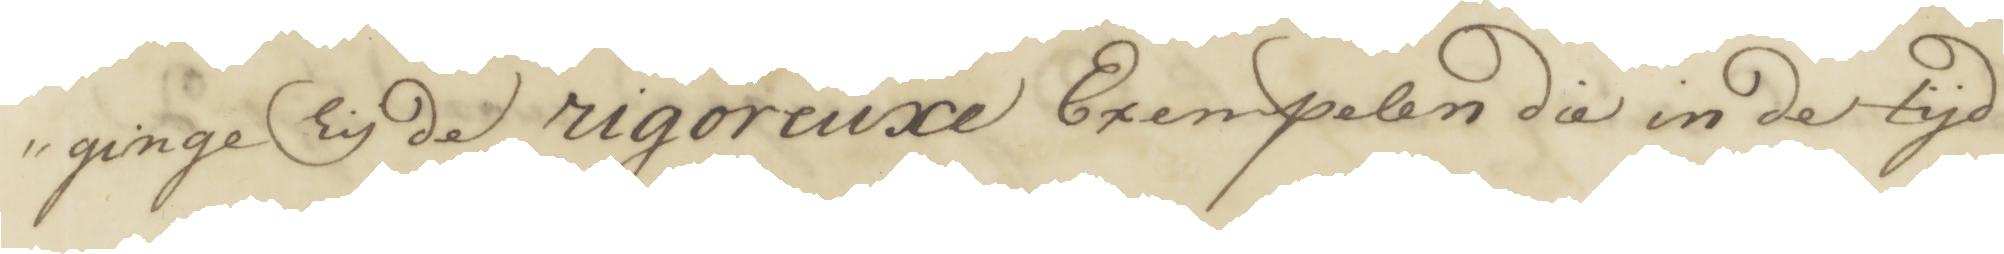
„ginge hij de rigoreuxe Exenpelen die in de tijd
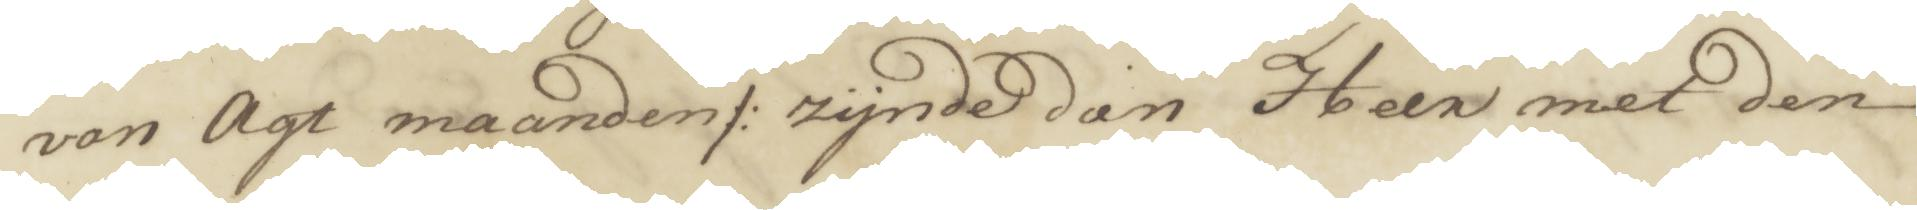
van Agt maanden :/: zijnde dien Heer met den
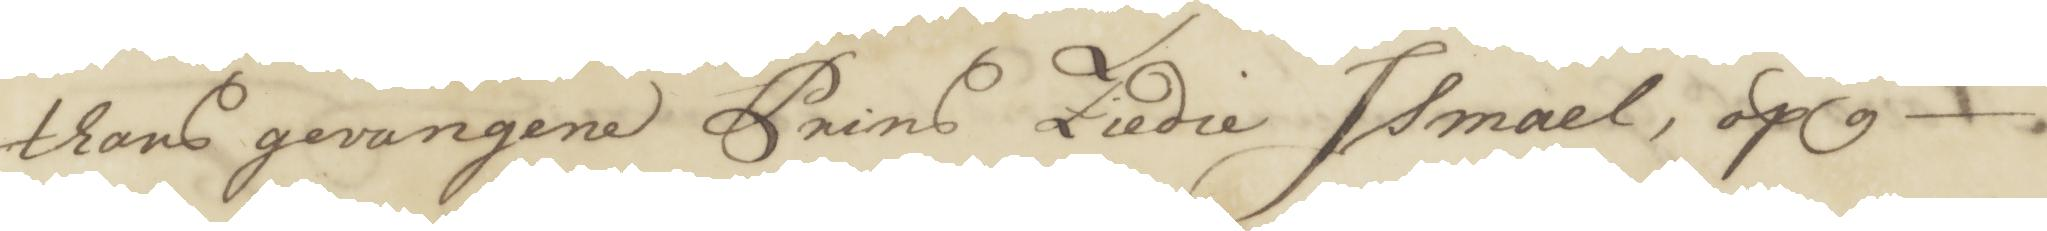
thans gevangene Prins Ziedie Jsmael, op 9 —
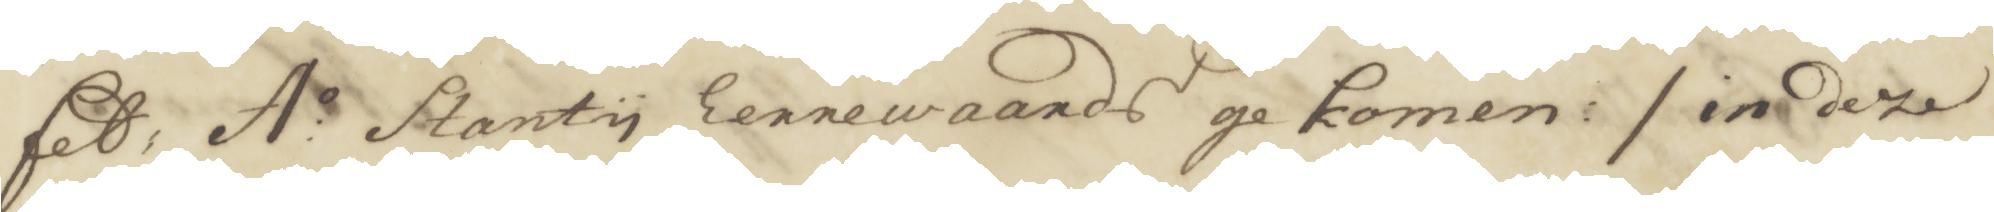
feb: A:o stantij herrewaards gekomen :/ in deze
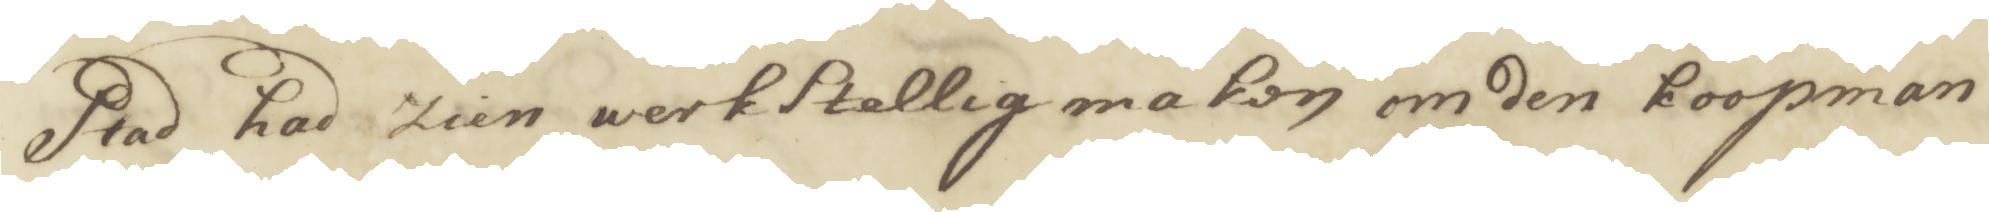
stad had zien werkstellig maken om den koopman
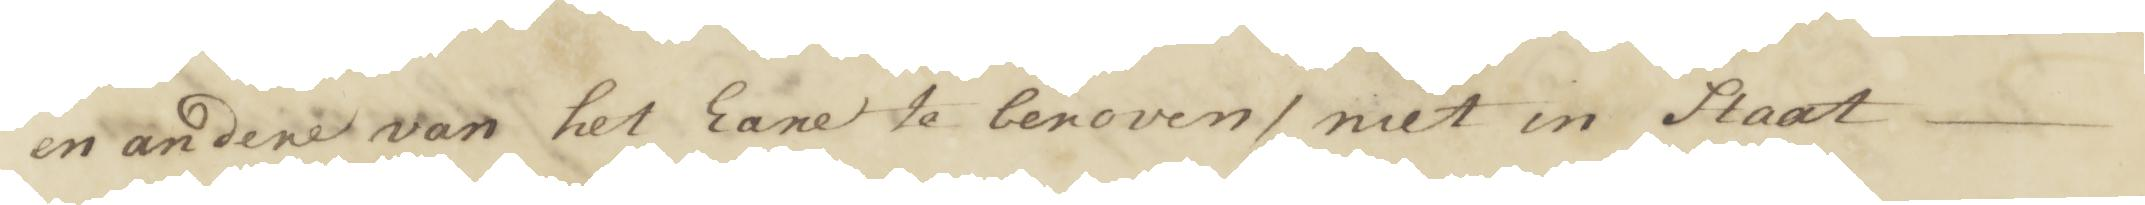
en andere van het hare te beroven, niet in staat —
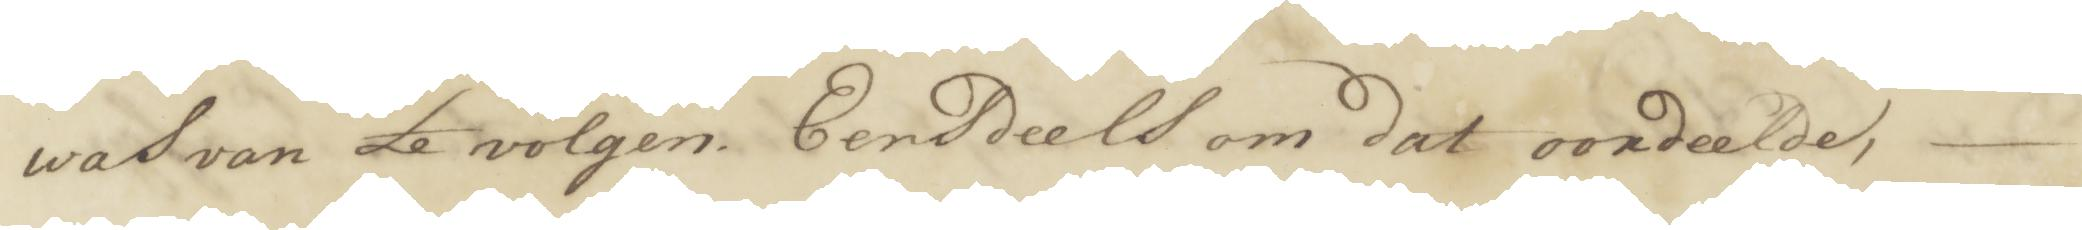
was van te volgen. Eensdeels om dat oordeelde, —
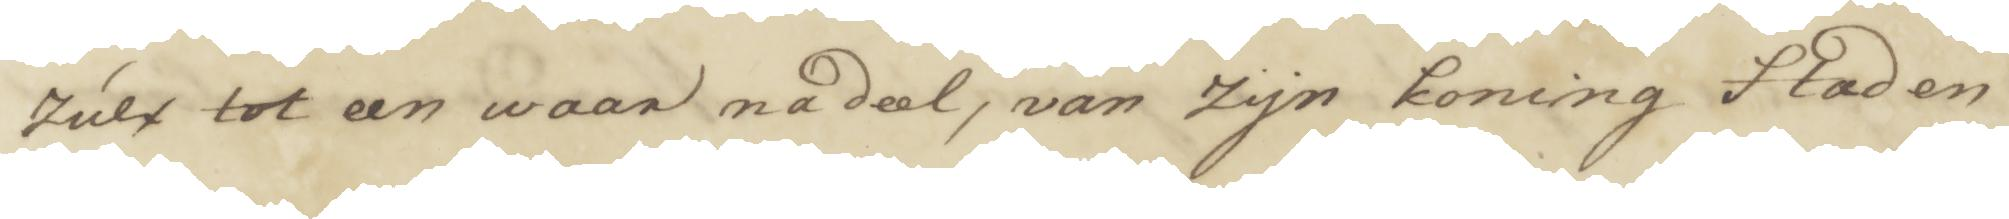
zulx tot een waar na deel, van zijn koning stad en
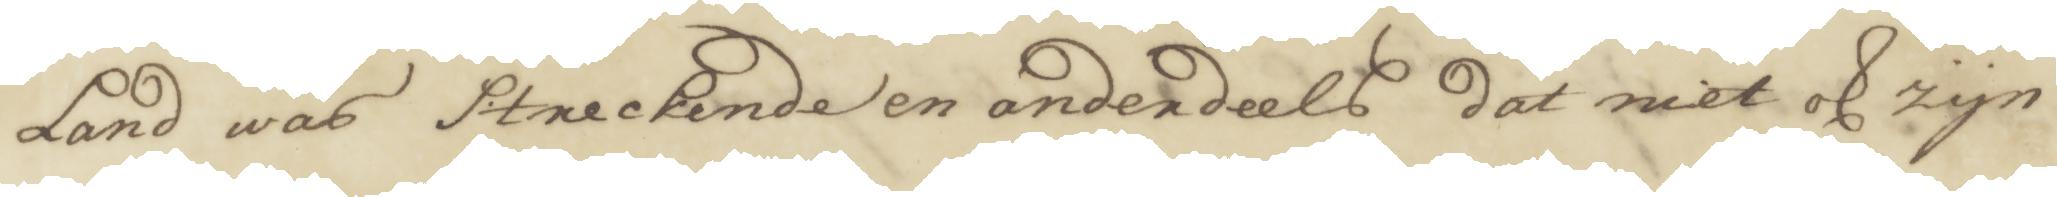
Land was streckende en anderdeels dat niet over zijn
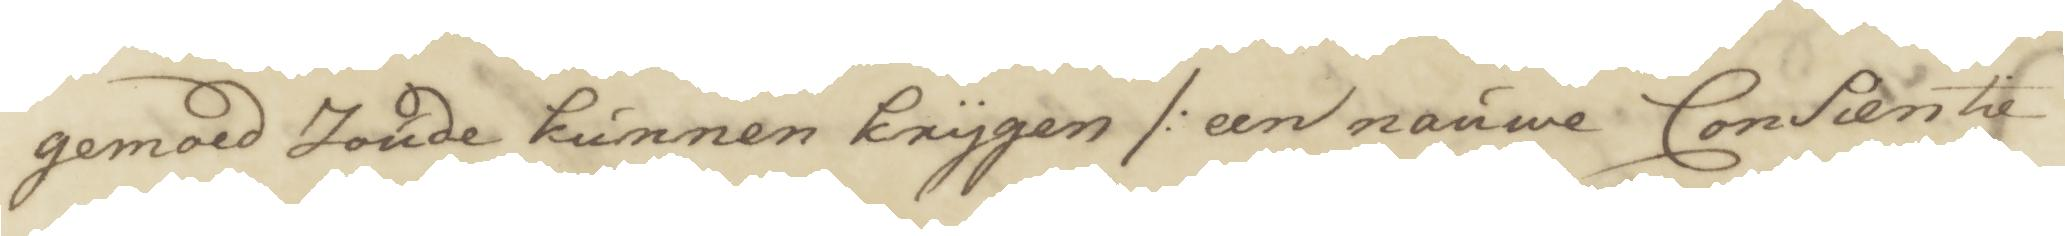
gemoed zoude kunnen krijgen /: een nauwe Consientie
